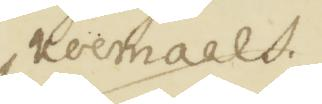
roemaals.
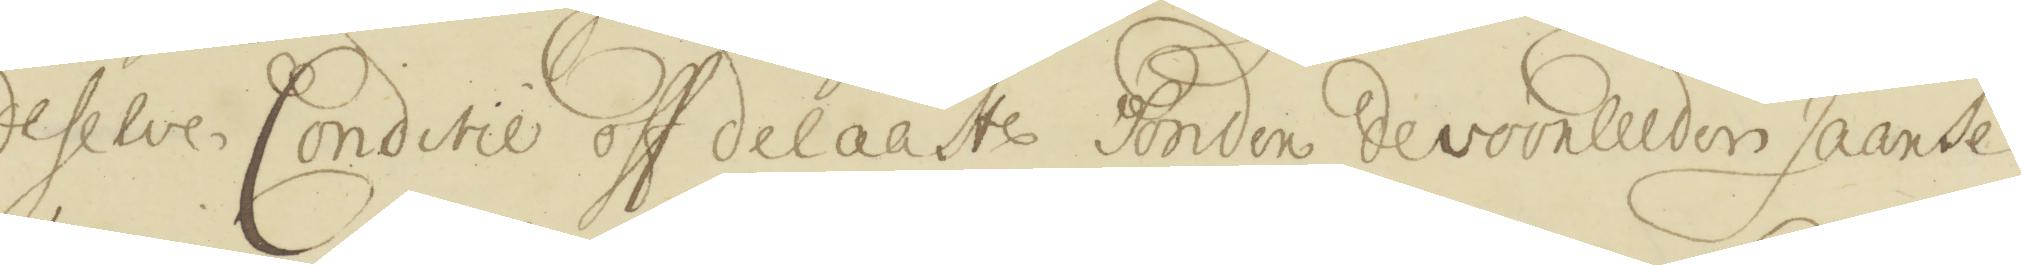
deselve Conditie off de laaste sonder de voorleeden Jaarse
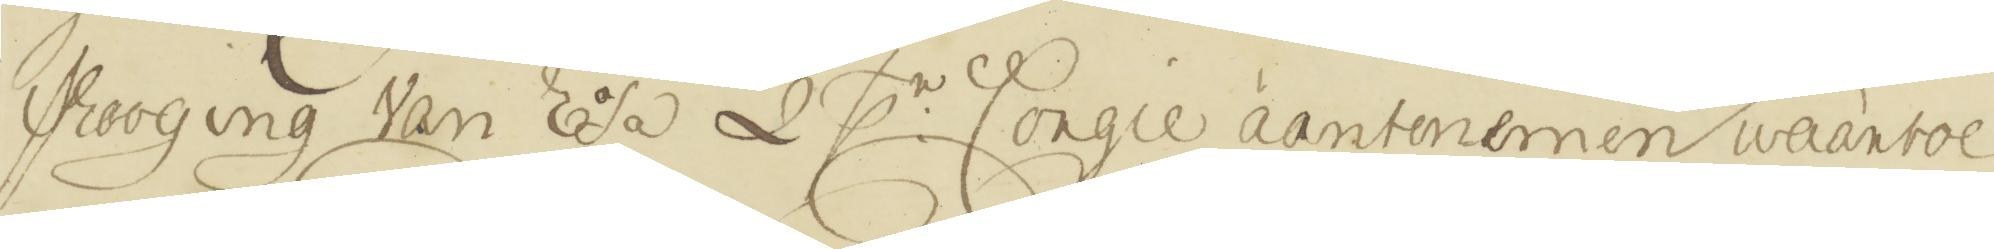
verhooging van ro/a 2 p:r Corgie aantenemen, waartoe
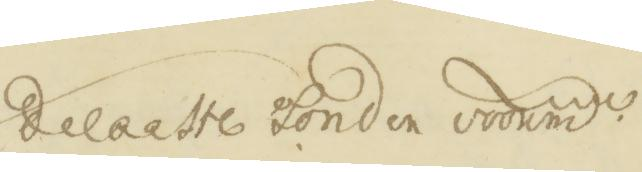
de laaste sonder voorm
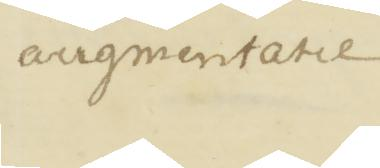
augmentatie
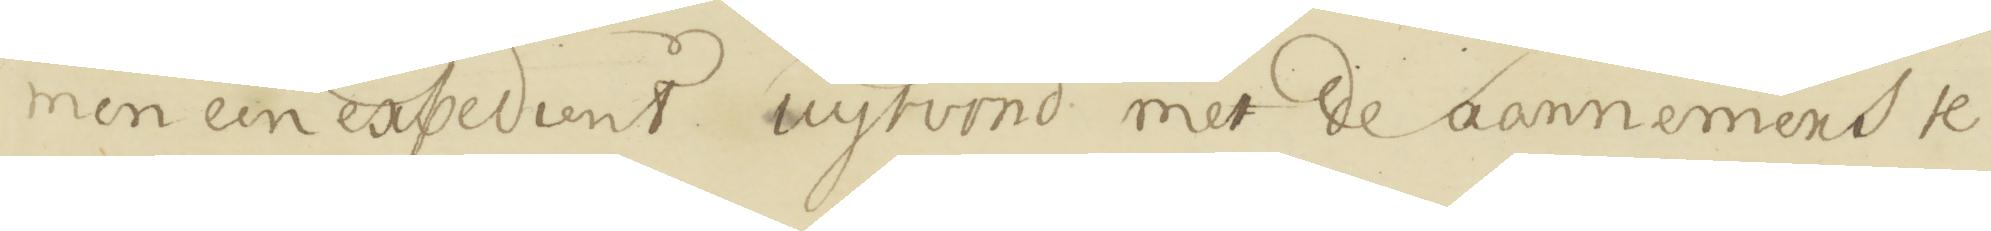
men een expedient uytvond met de aannemers te
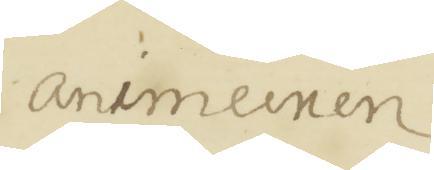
animeeren
